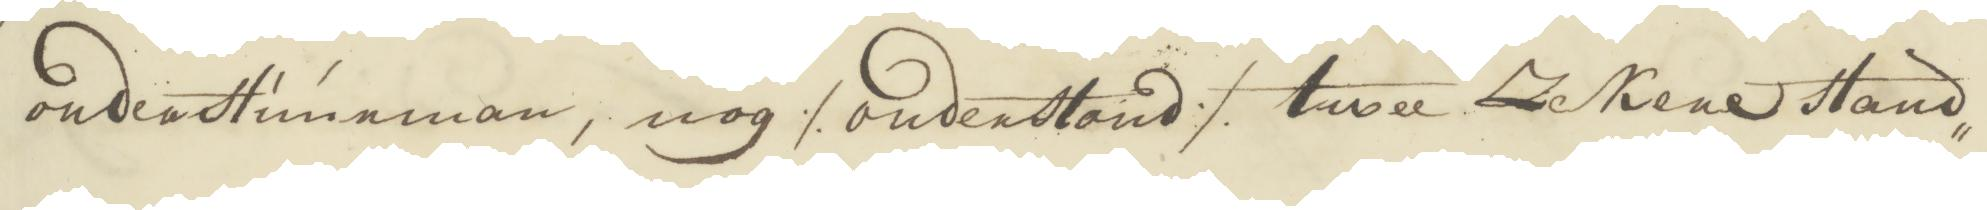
onderstuurman, nog ./. onderstond ./. twee zekere stand„
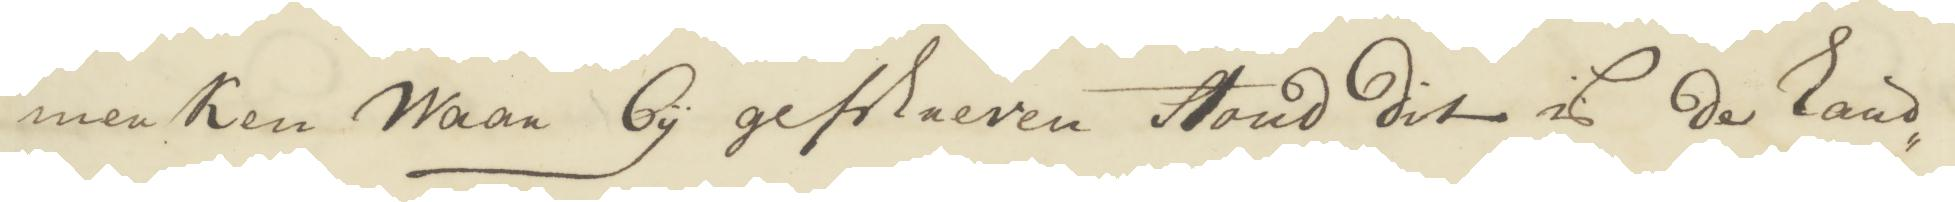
merken waar bij geschreven stond dit is de hand„
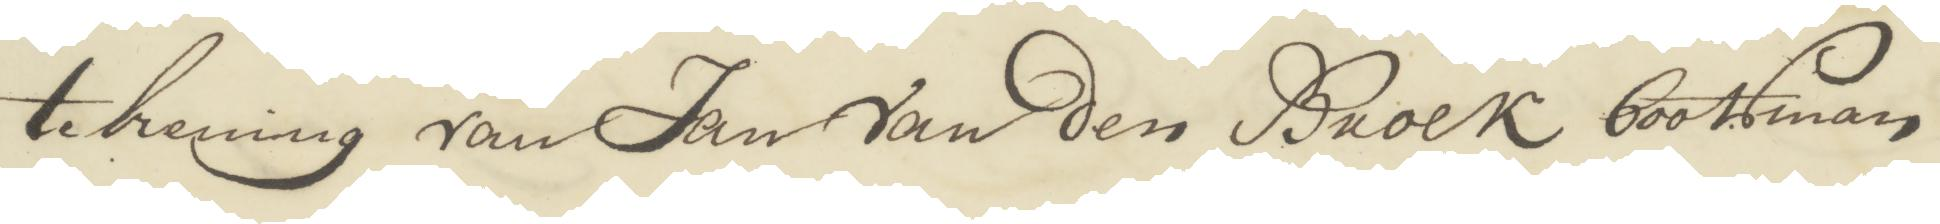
tekening van Jan van den Broek bootsman
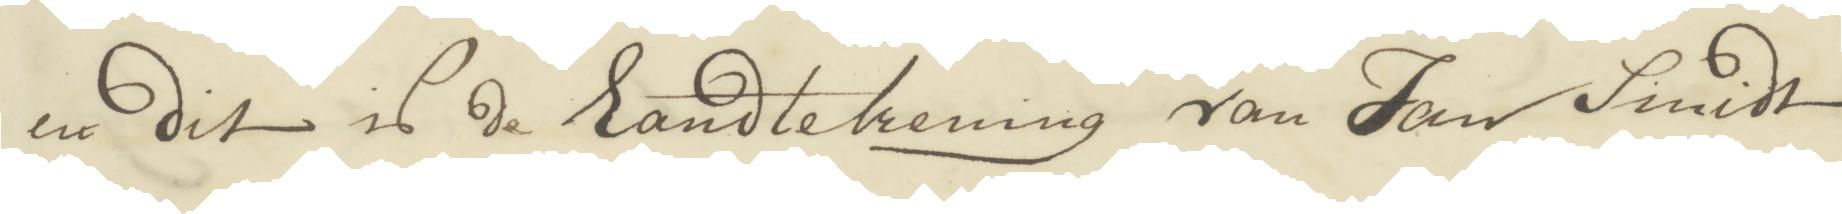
en dit is de handtekening van Jan smidt
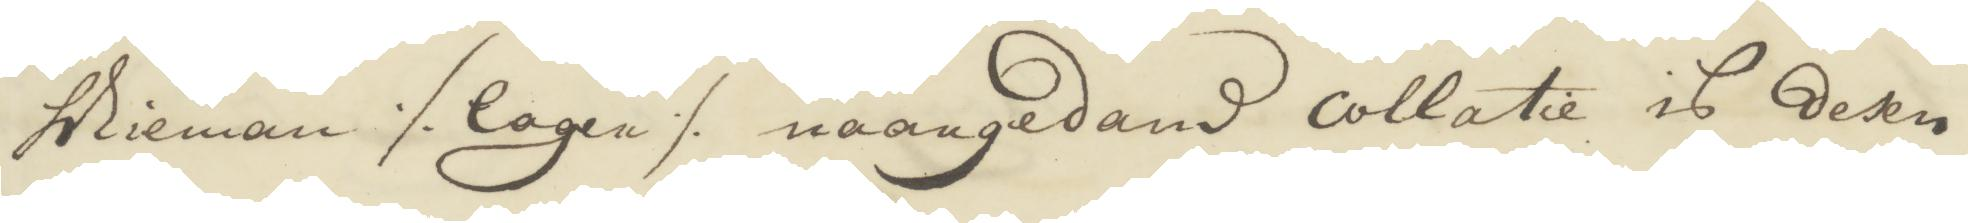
schieman ./. lager ./. naargedane collatie is desen
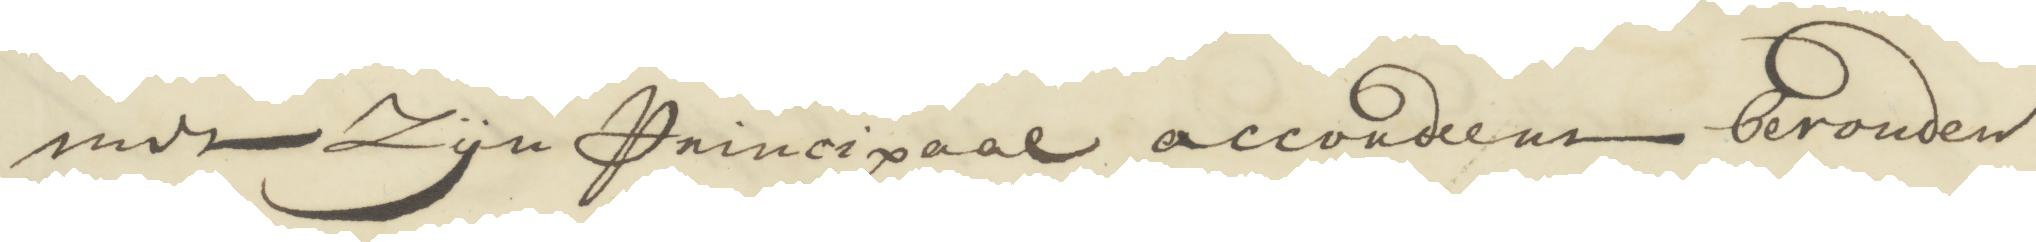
met zijn principaal accordeert bevonden
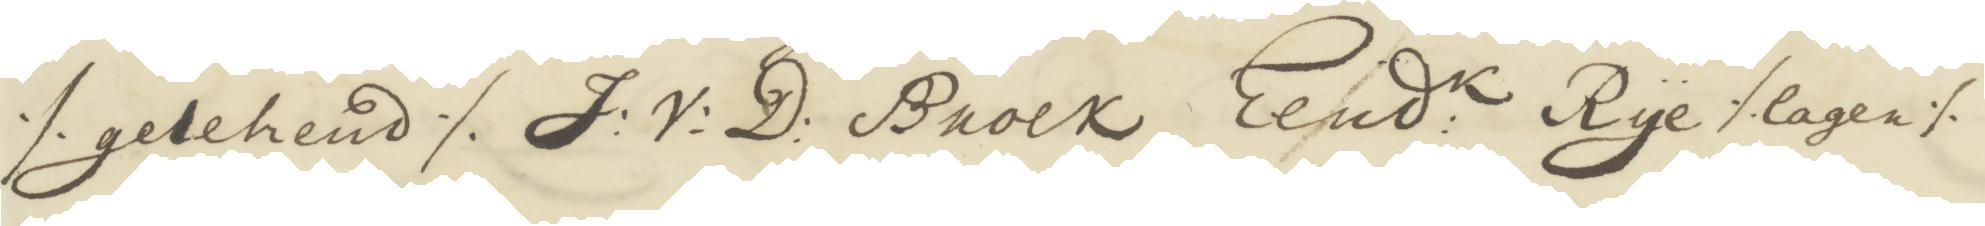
./. getekend ./. J: V: D: Broek, Hend:k Rije ./.lager ./.
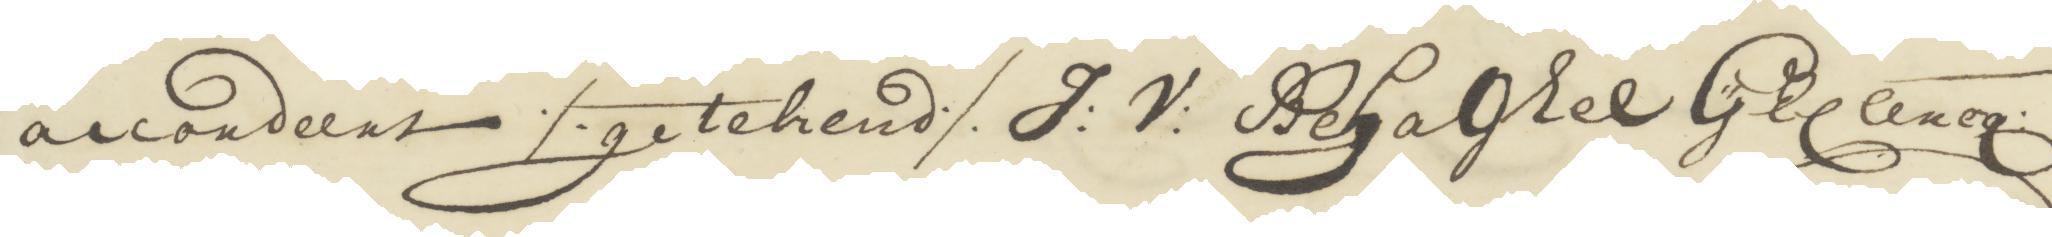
accordeert ./. getekend ./. J: V: Behaghel GEclercq:
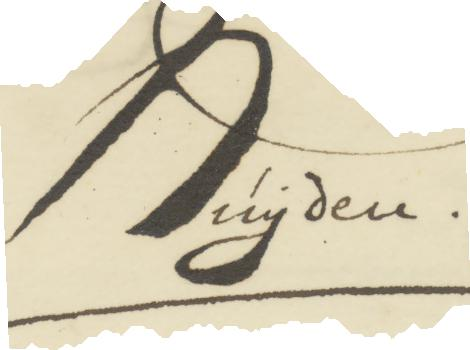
Huijden
